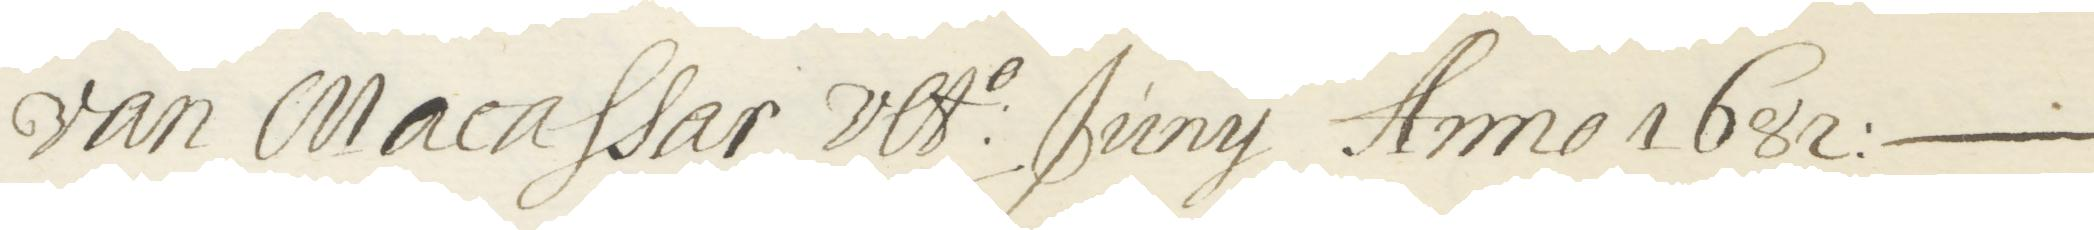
Van Macassar Vlt:o Junij Anno 1682:—
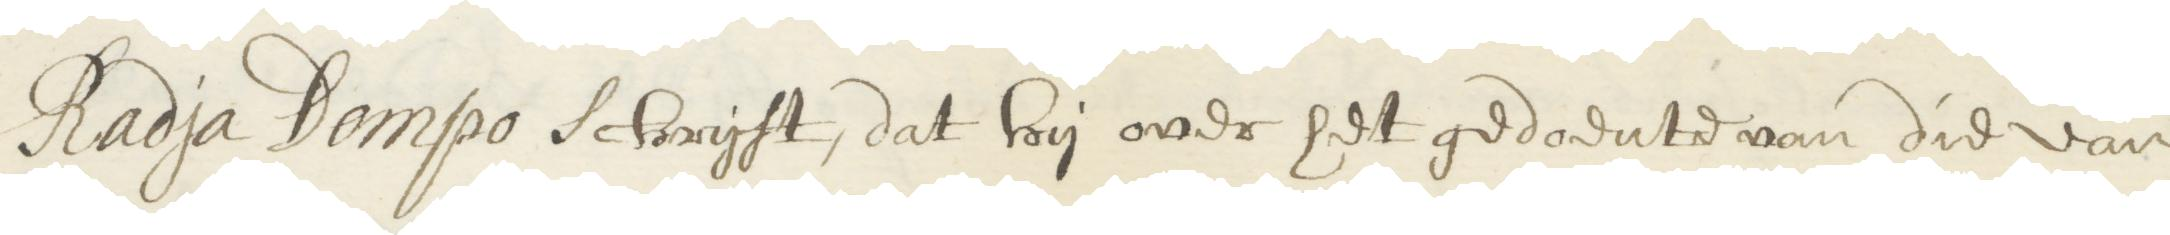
Radja Dompo Schrijft, dat hij over het gedoente van die van
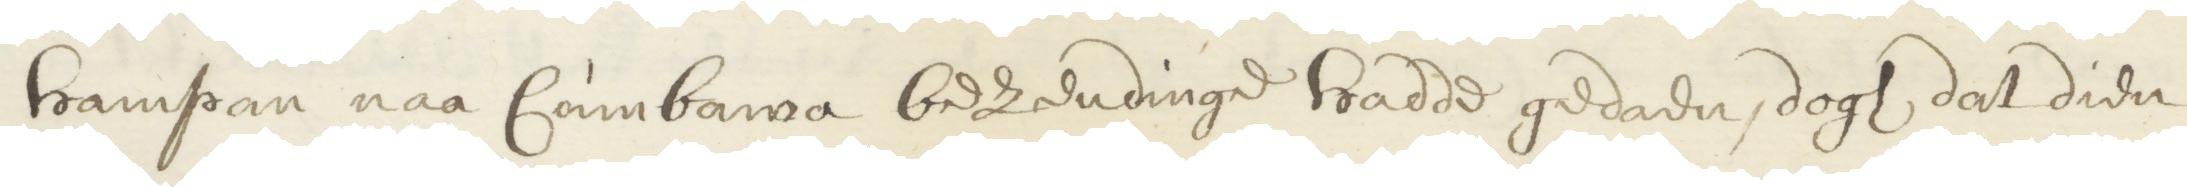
hampan naa Counbawa bezendinge hadde gedaen, dogh dat dien
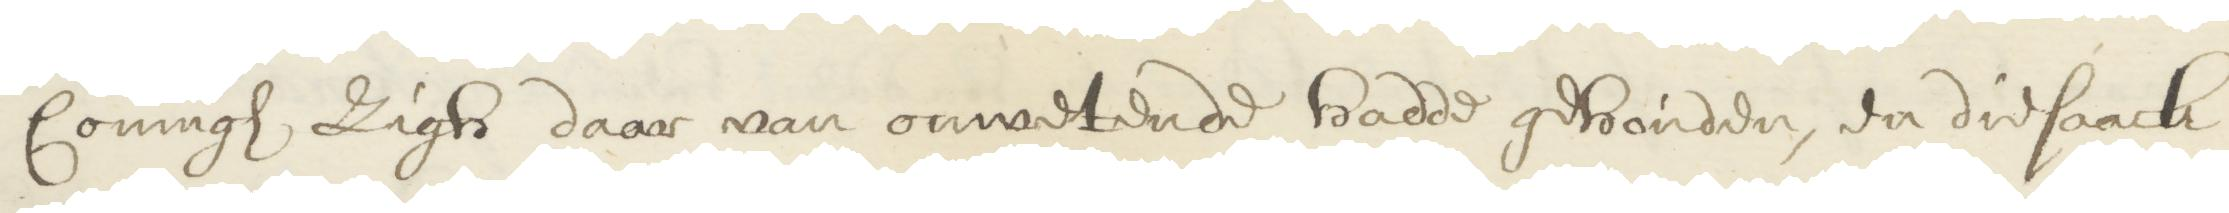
Coningh Zigh daar van onwetende hadde gehouden, en die saack
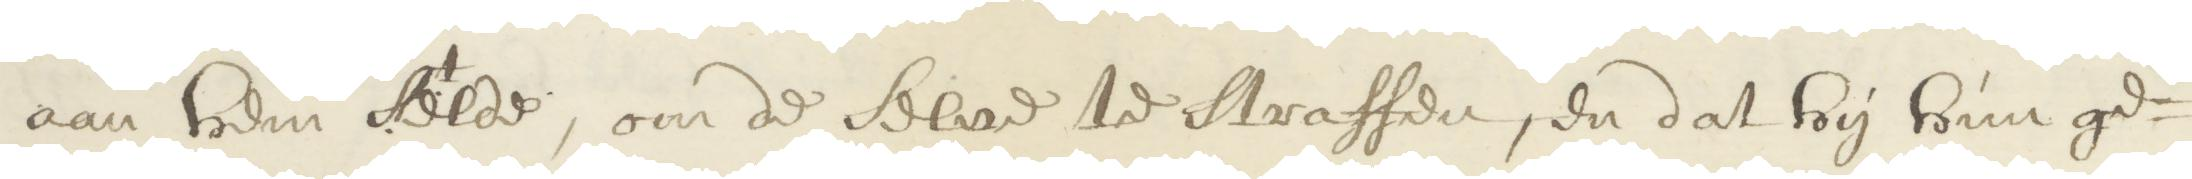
aan hem selde, om de selve te straffen, en dat hij hun ge=
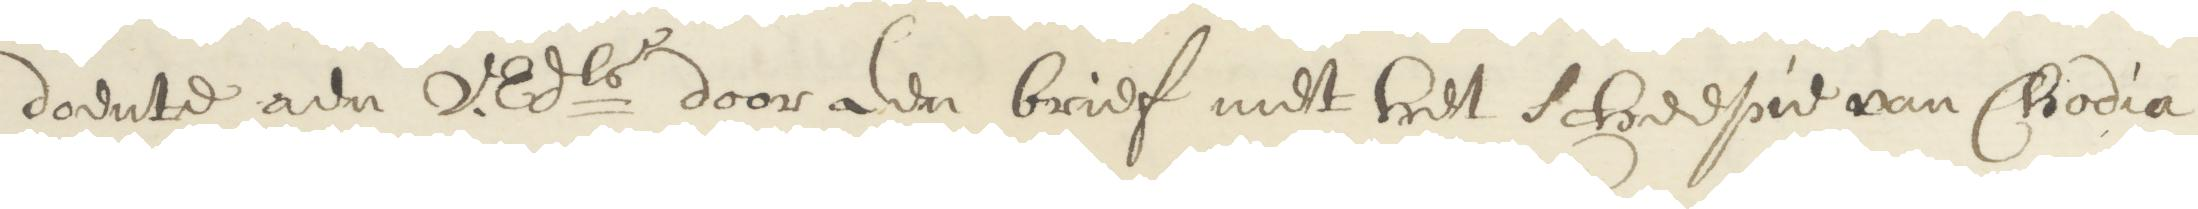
doente aen V.Ed=ls door Een brief met het scheepie van Chodia
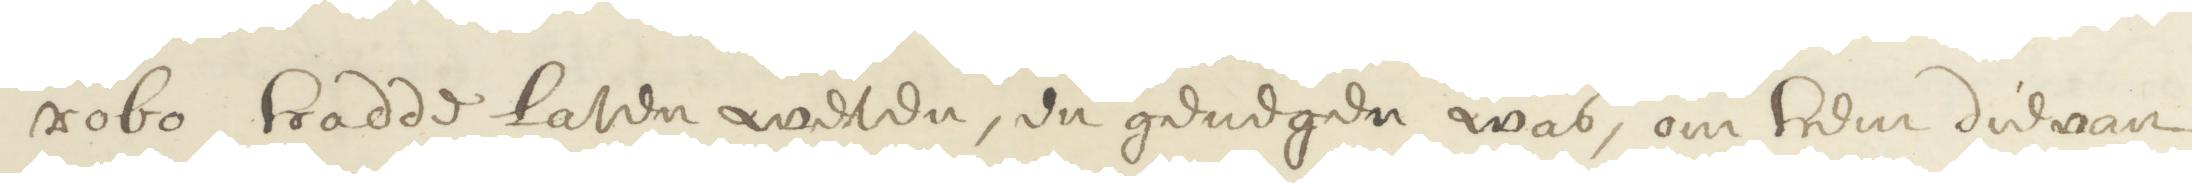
robo hadde laten weten, en genegen was, om hem die van
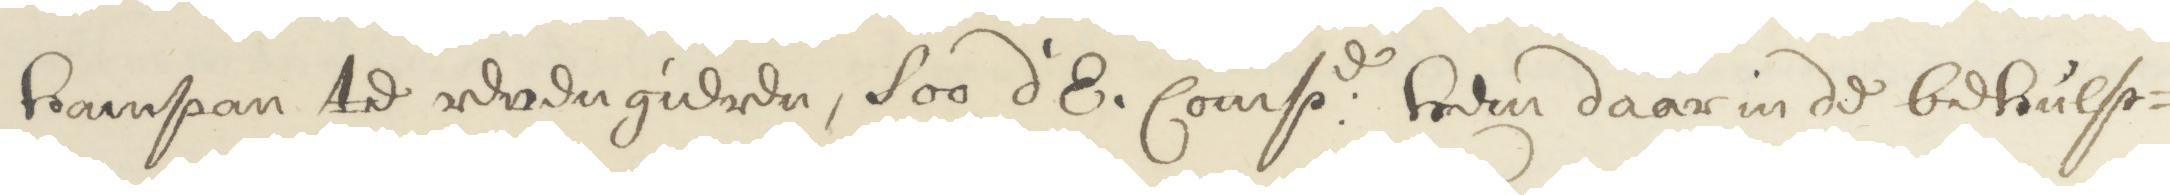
hampan te revengieren, Soo d’E. Comp:e hem daar in de behulp=
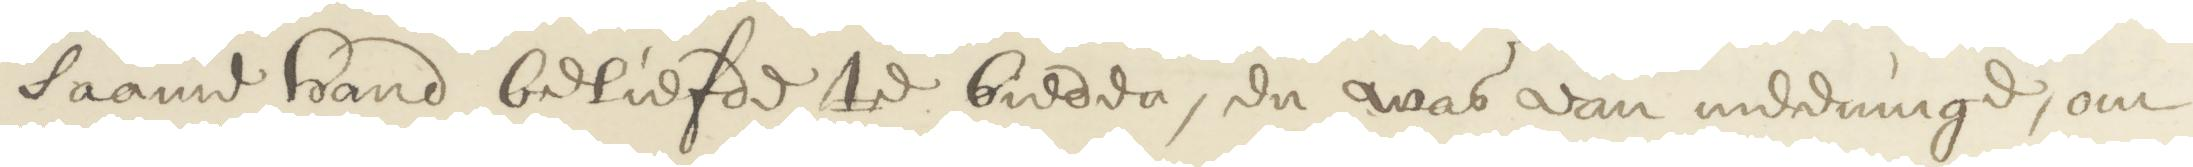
saame hand beliefde te bieden, en was van meeninge, om
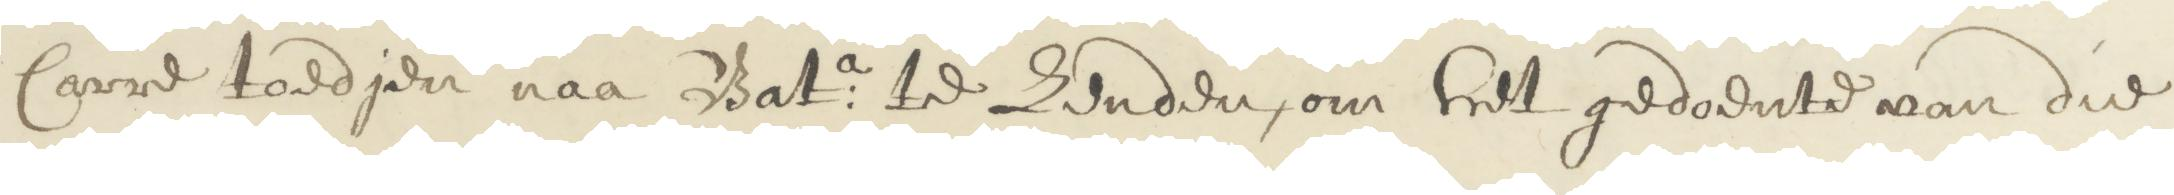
Carre toedjen naa Bat:a te Zenden, om het gedoente van die
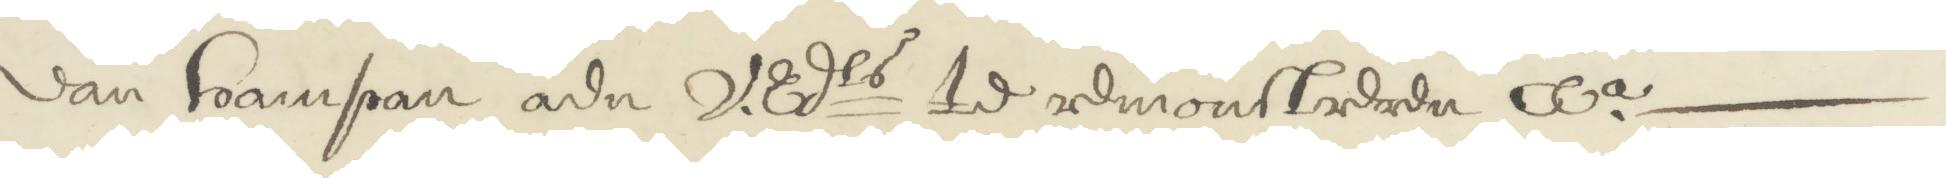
van hampan aen V.Ed=ld te remonstreren &:a —
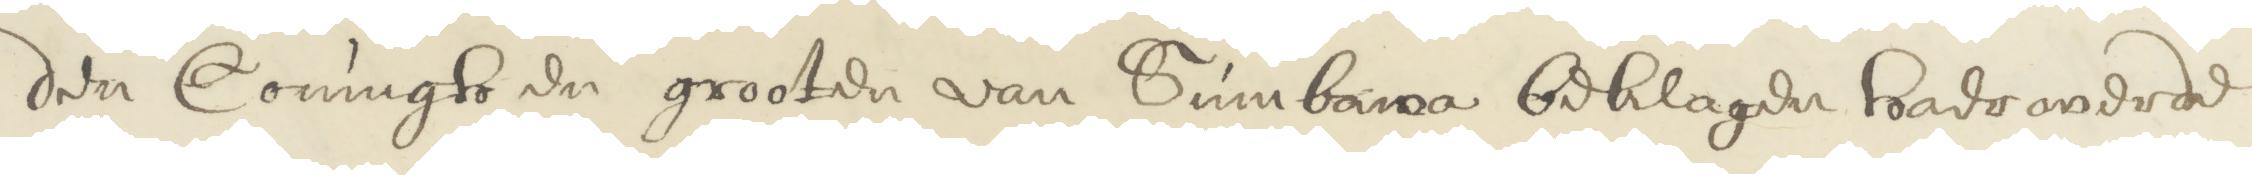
den Coningh en grooten van Sumbawa beklagen haer werde
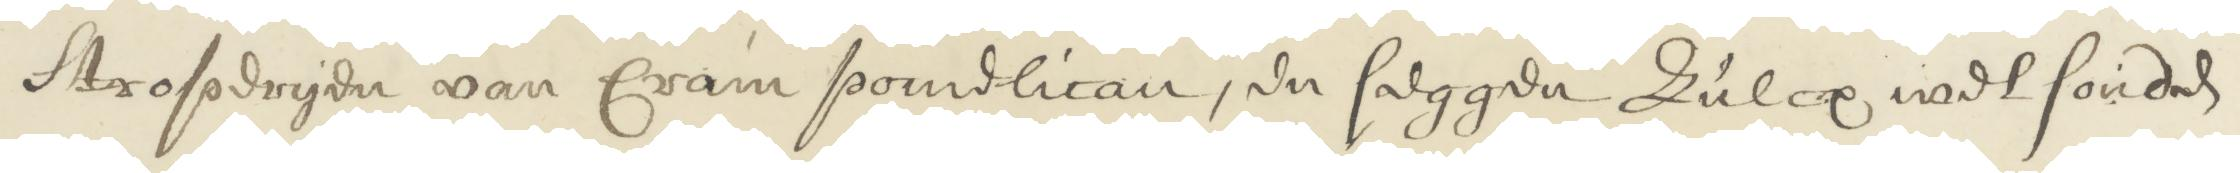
Stroperijen van Crain pomelican, en seggen Zulcx wel souden
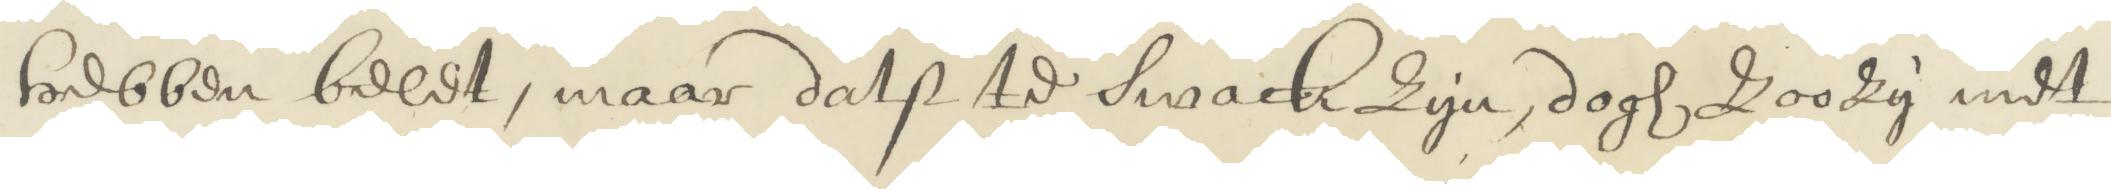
hebben belet, maar datse te Swack Zijn, dogh Zoo Zij met
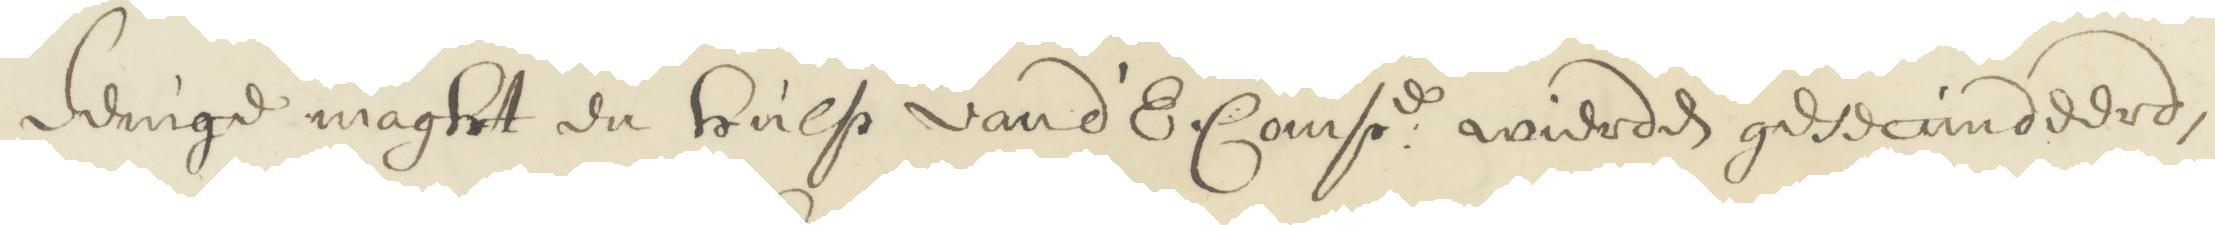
Eenige maght en hulp van d’ E Comp:e wierden gesecundeerd,
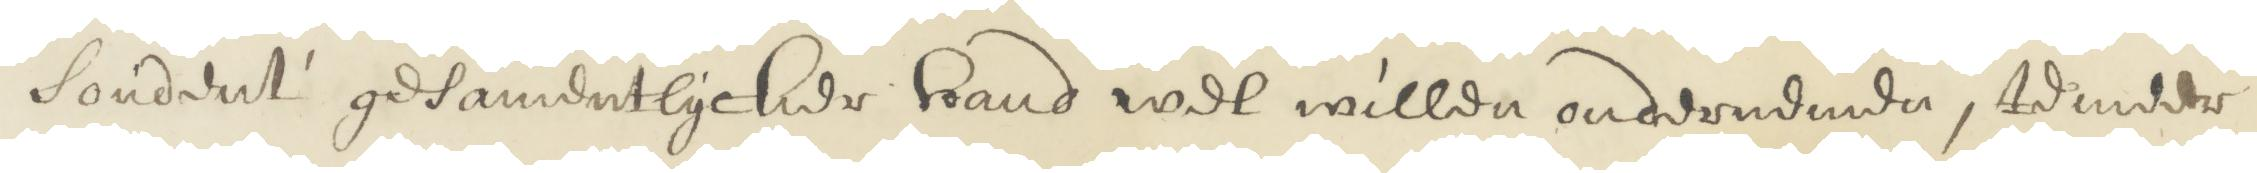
soudent' gesamentlijcker hand wel willen ondernemen, te meer
